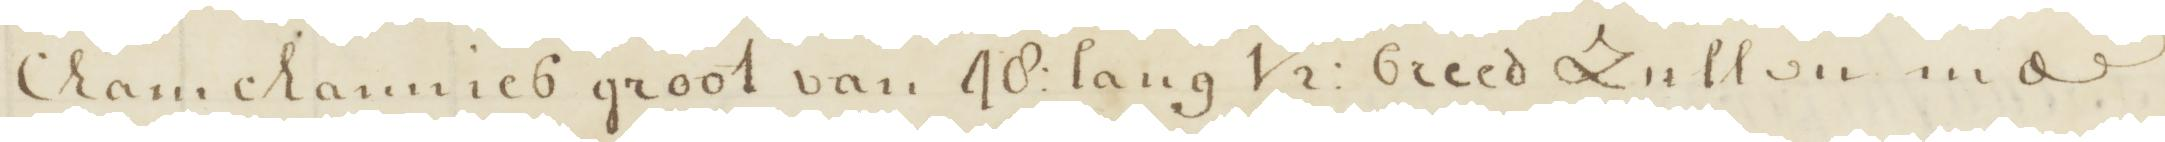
Chamchannies groot van 48: lang 1½: breed zullen in de
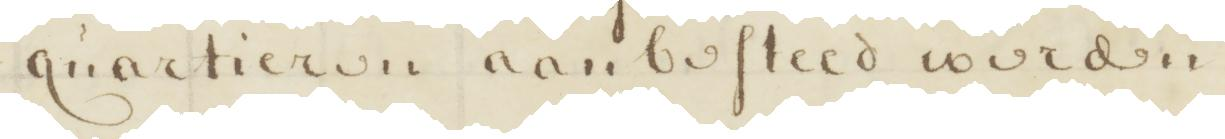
quartieren aanbesteed werden
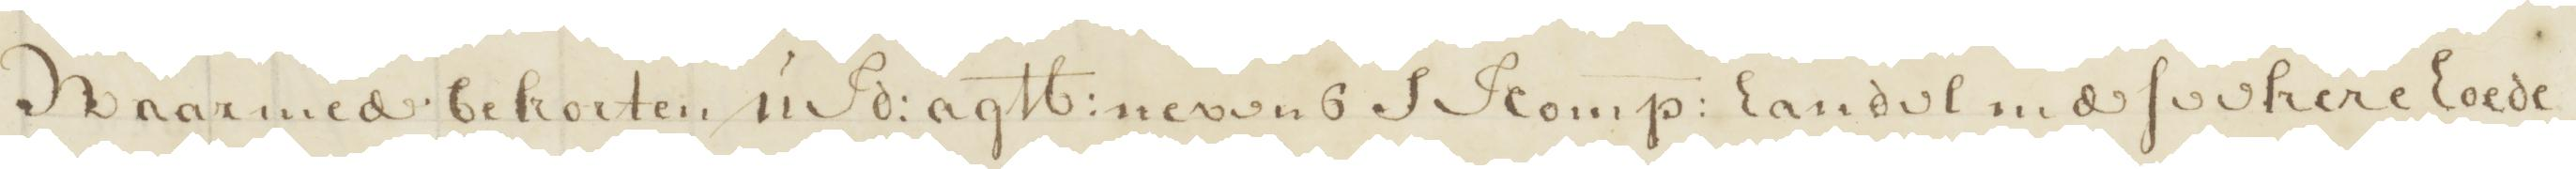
Waarmede bekorten u Ed: agtb: nevens ’s Ecomp: handel in de seekere hoede
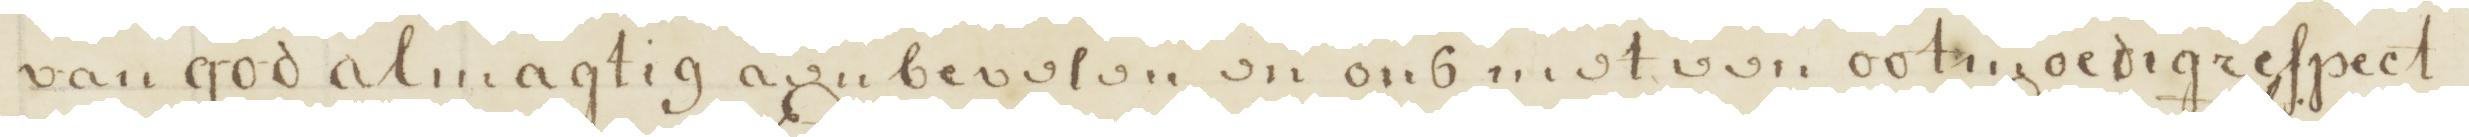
van god almagtig aenbevelen en ons met een ootmoedig respect
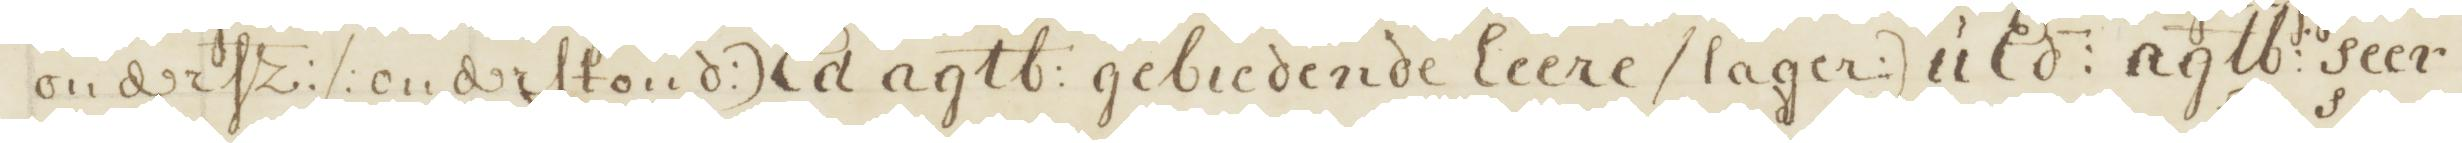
ondersz: /: onderstond:) Ed agtb: gebiedende heere / lager :) u Ed: agtb: seer
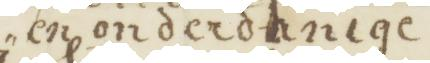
en onderdanige
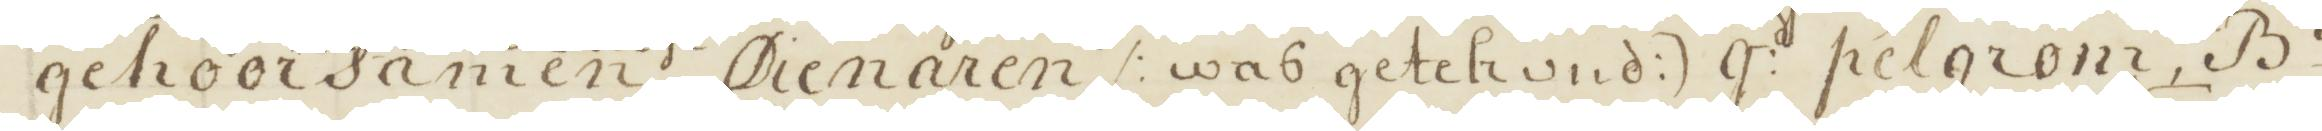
gehoorsamen Dienaren /: was getekend :) G: Pelgrom, B=s
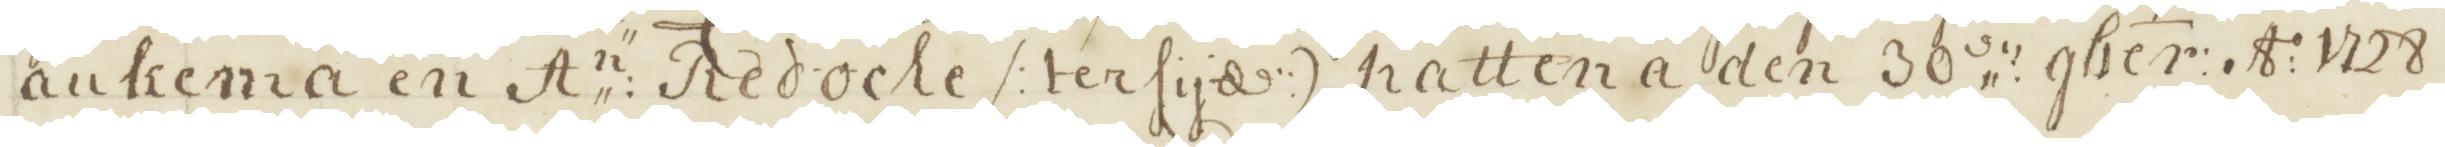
ankema en A„n: Redoche /: ter sijde :) pattena den 30„.en 9ber: A:o 1728
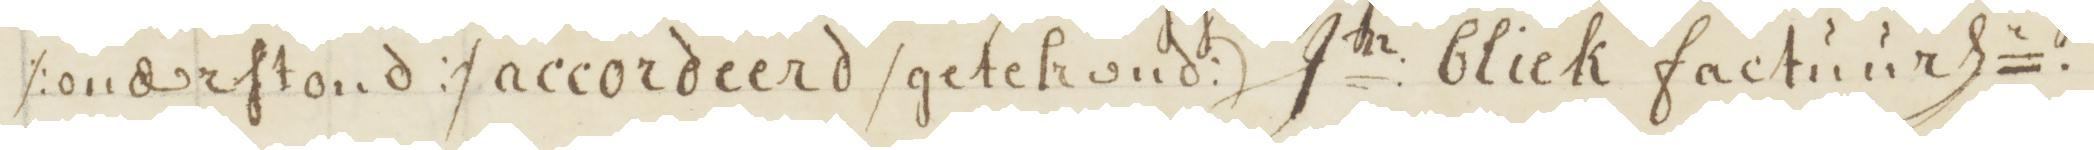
/: onderstond :/ accordeerd / getekend :) J=n bliek factuurh=r.
